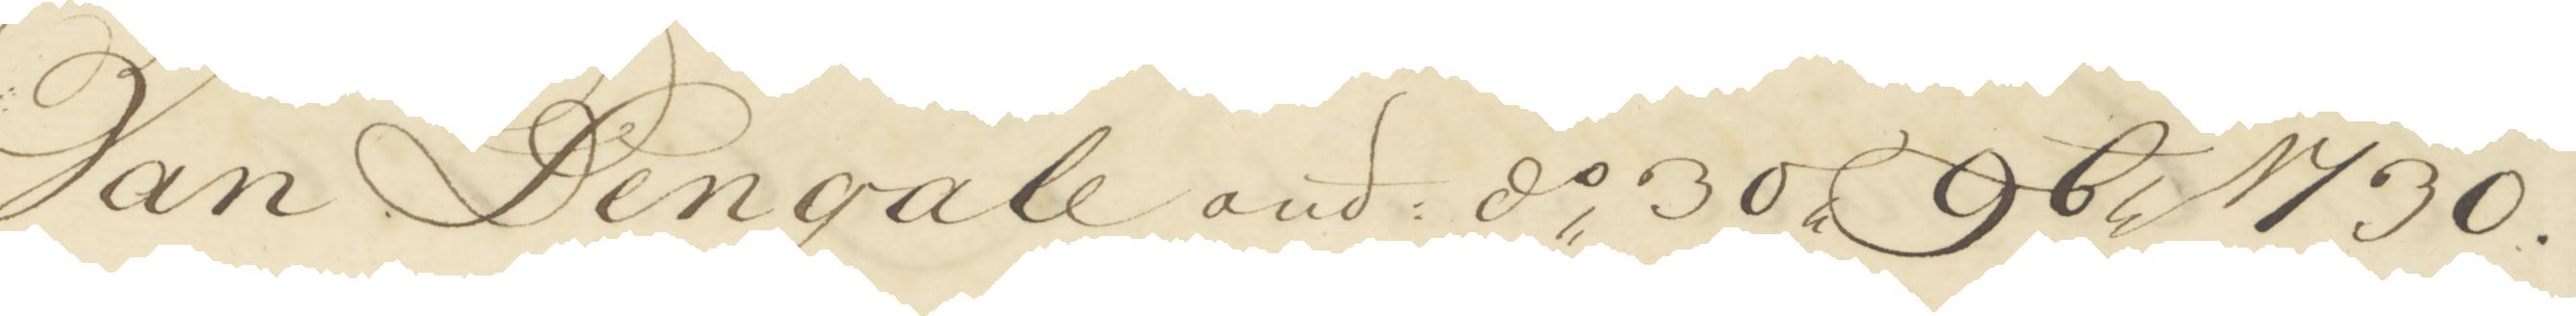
Van Bengale ond: d„o 30„ 9b„ 1730.
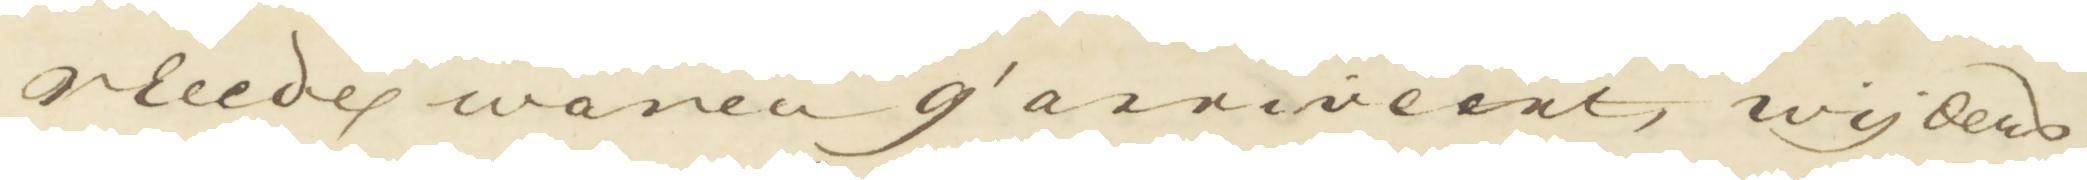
rheede wanen g'arriveert, wijder
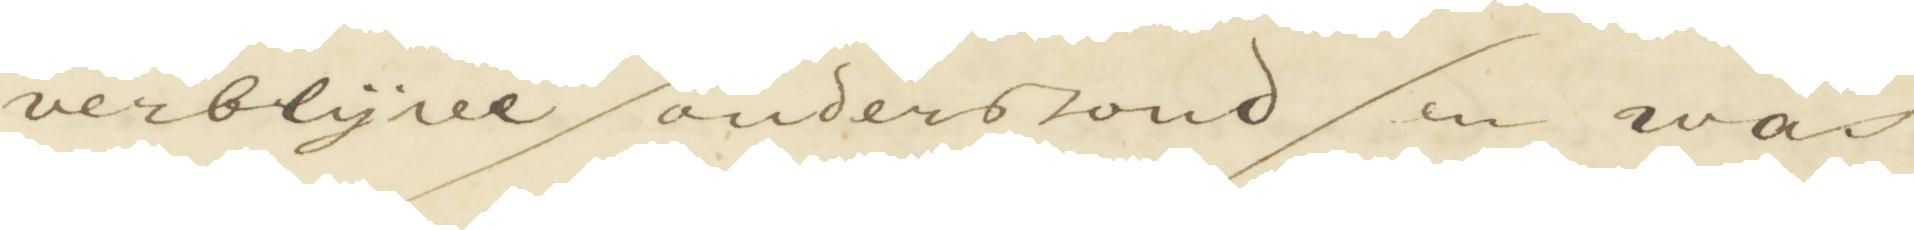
verblijve /onderstond/ en was
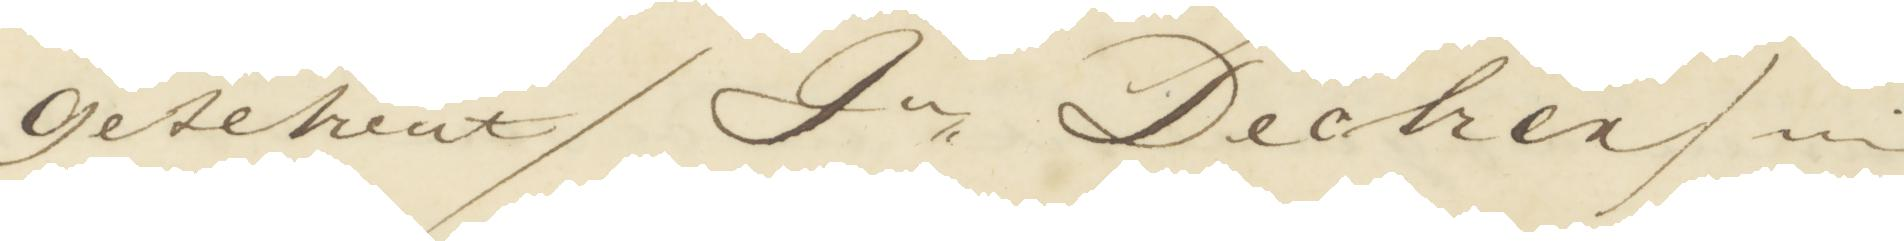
getekent/ J„n Decker / in
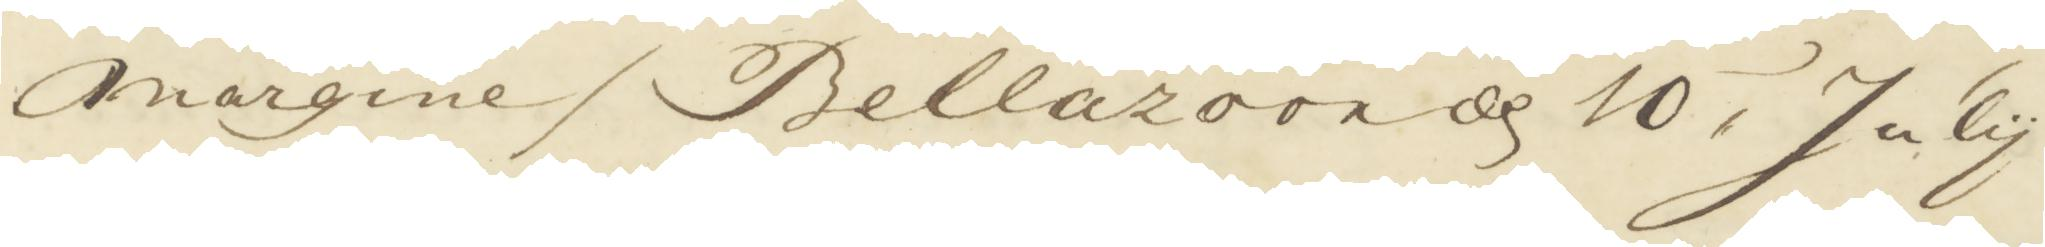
margine /Bellazoor den 10„' Julij
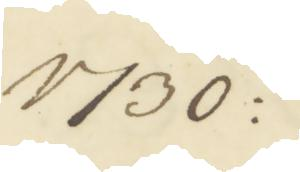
1730:
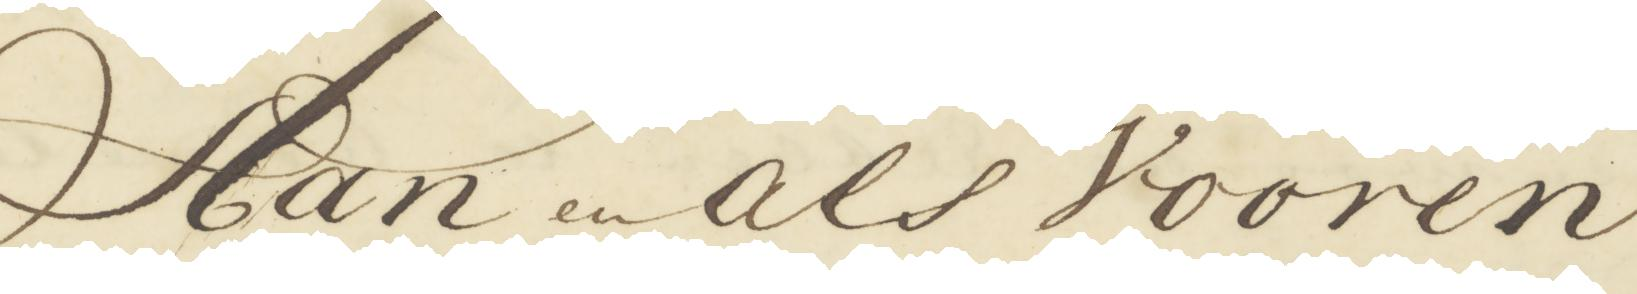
Aan en als vooren
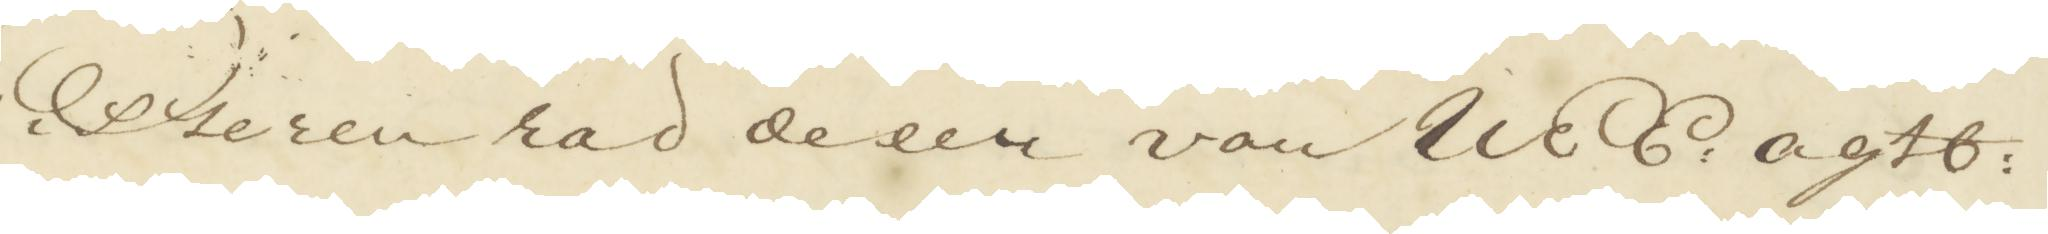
Gisteren had de eer van UEE: agtb:
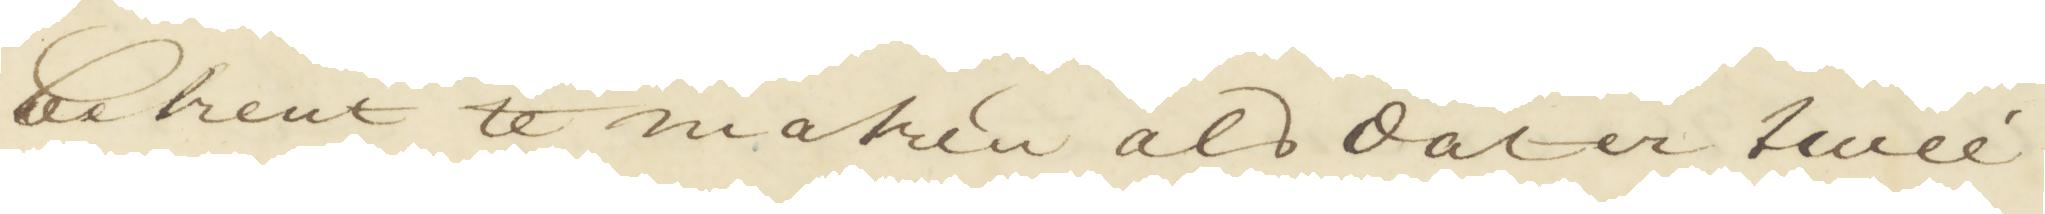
bekent te maken als dat er twee
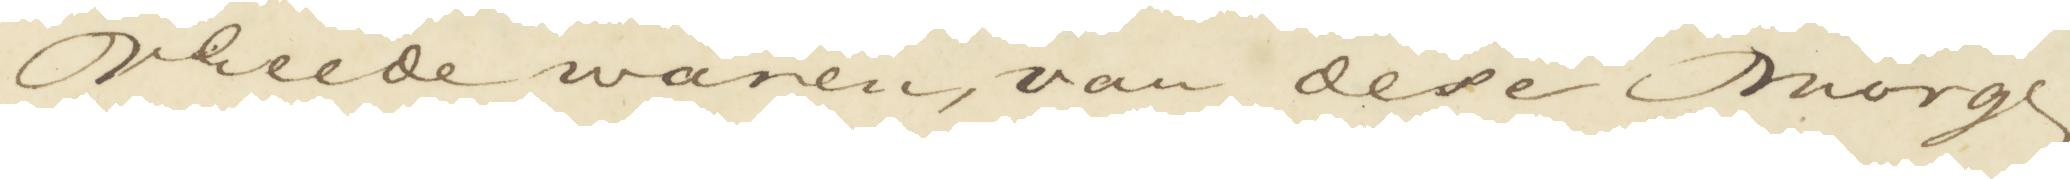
rheede waren, van dese Morgen
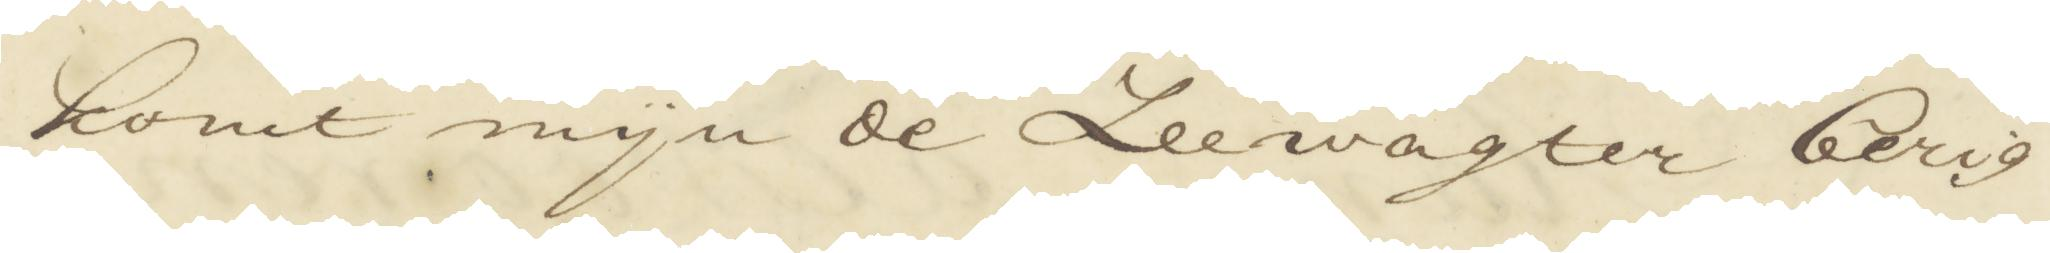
komt mijn de Zeewagter berig
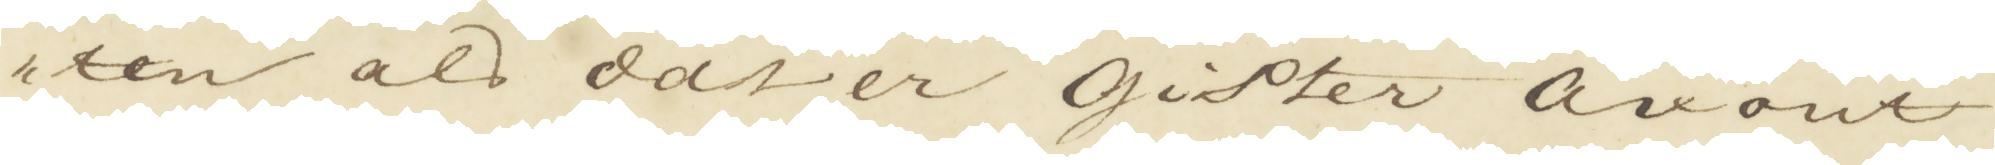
„ten als dat er gister avont
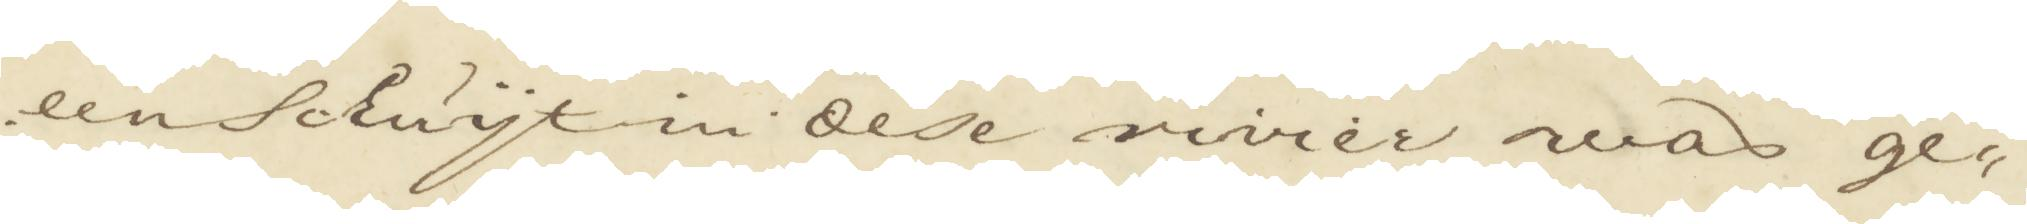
een schuijt in dese rivier was ge„
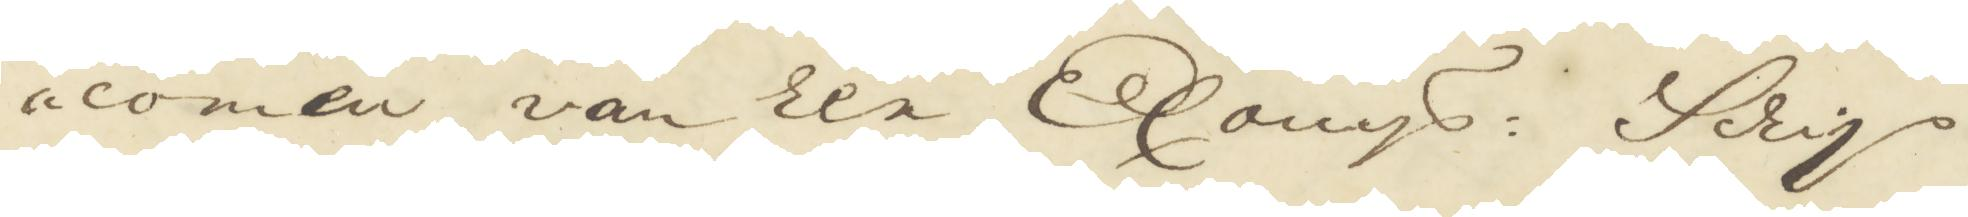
comen van het EComp: schip
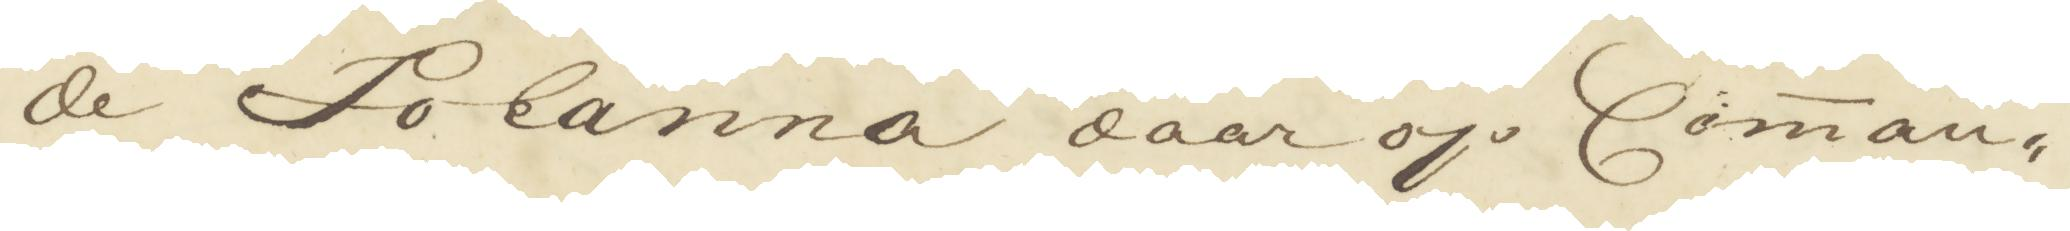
de Johanna daar op Coman„
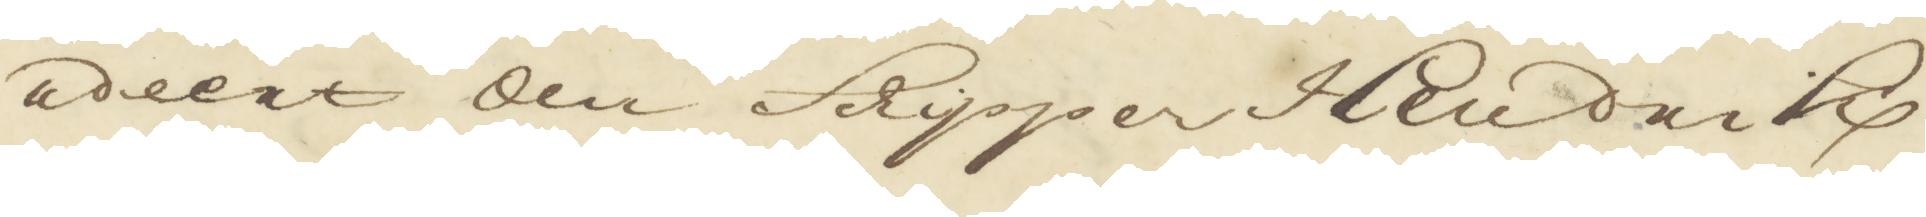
deert den schipper Hendrik
